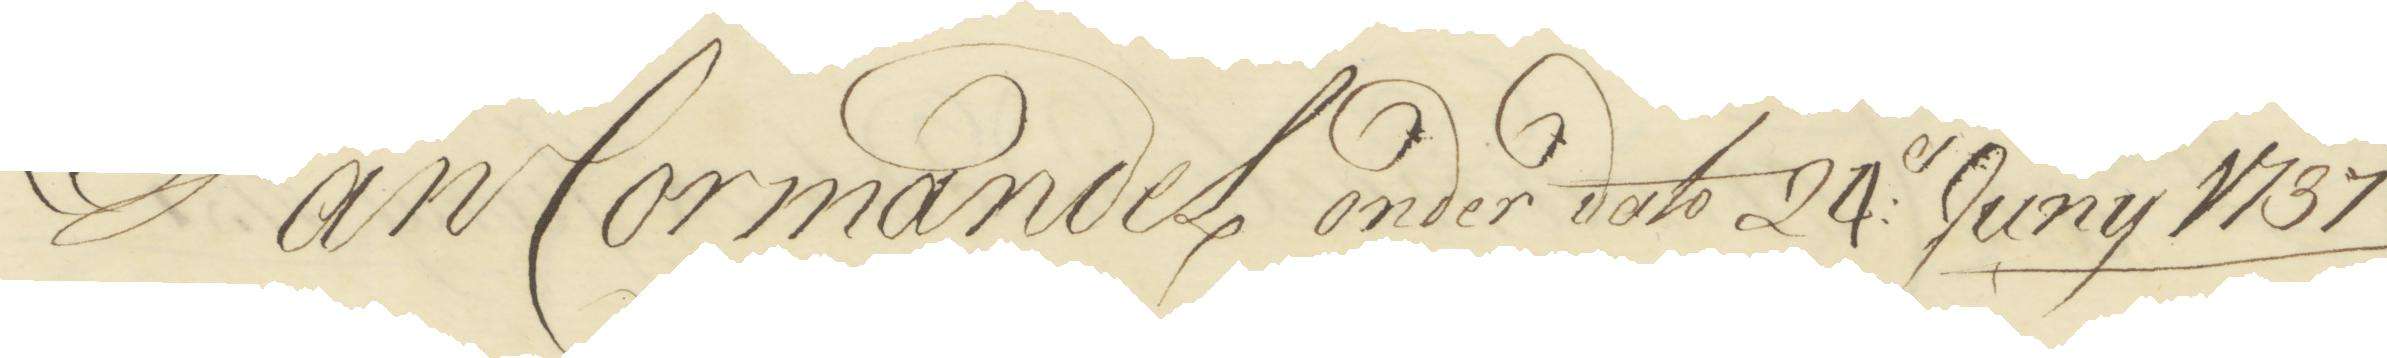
Van Cormandel onder dato 24:' Juny 1737
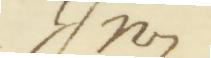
Jn,
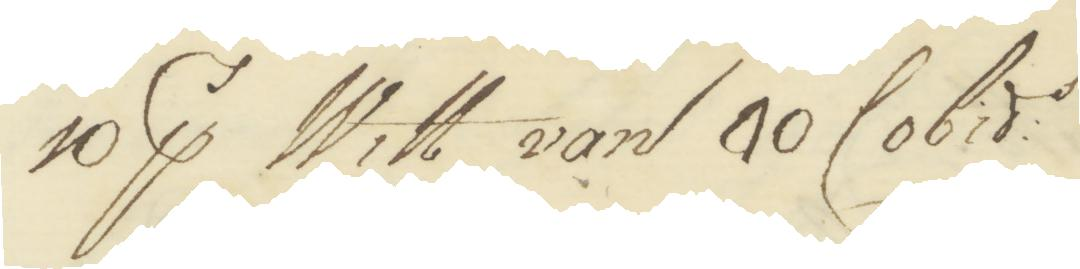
10 ps Witt van 40 Cobid:s
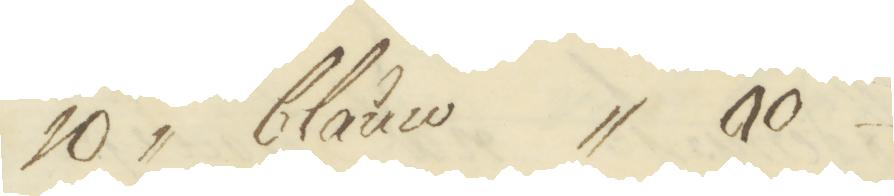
10 „ blauw „ 40 _o
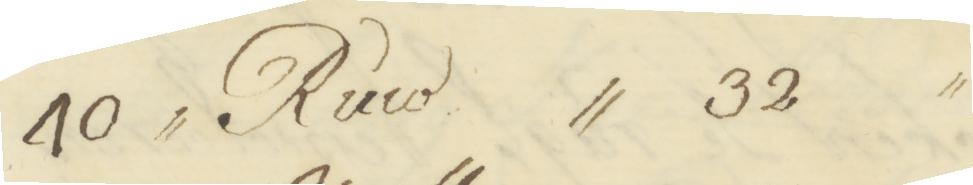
40 „ Ruw „ 32 „
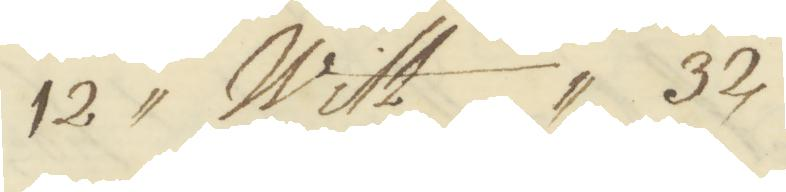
12 „ Witt „ 32
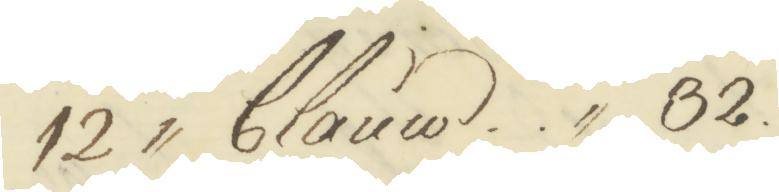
12 „ blauw . . „ 32.
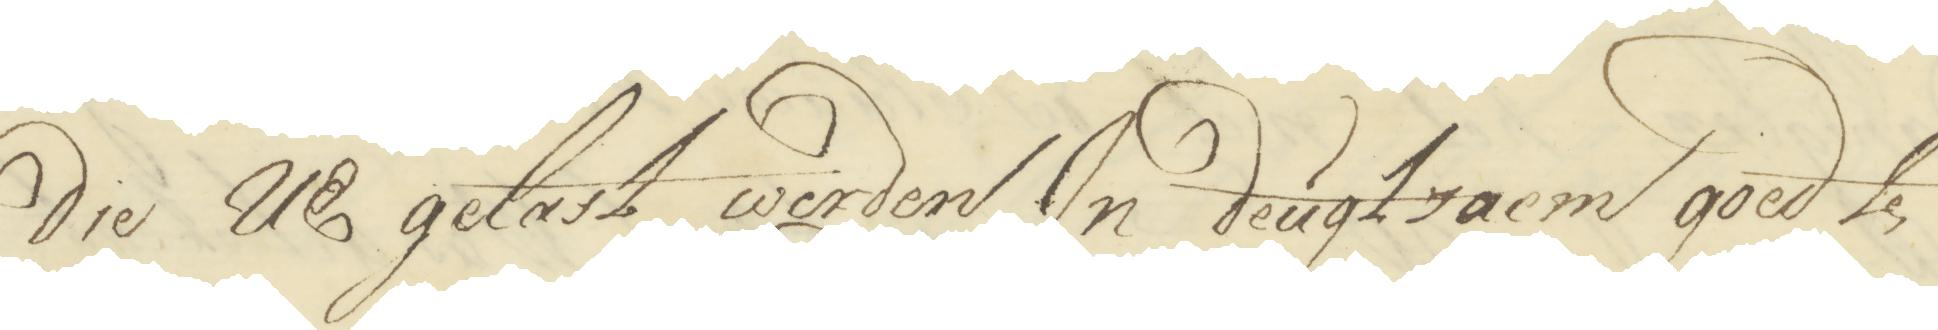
die UE gelast werden Jn deugtsaem goed te
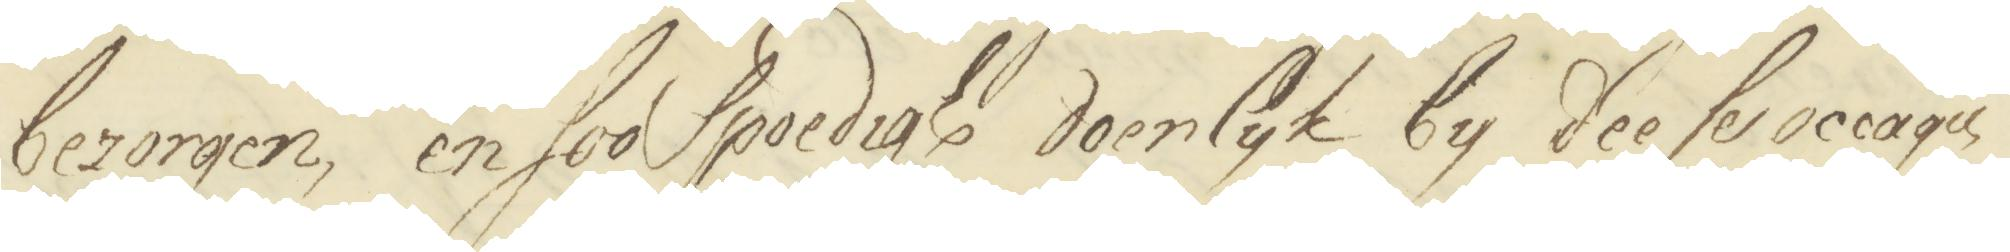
bezorgen, en soo spoedigh doenlyk by deese occagien
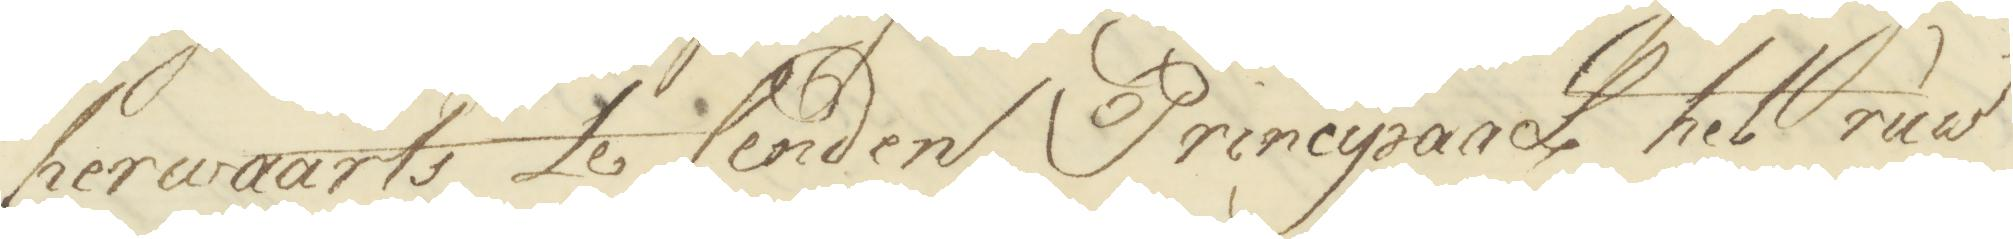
herwaarts te senden, Princypaal het ruw
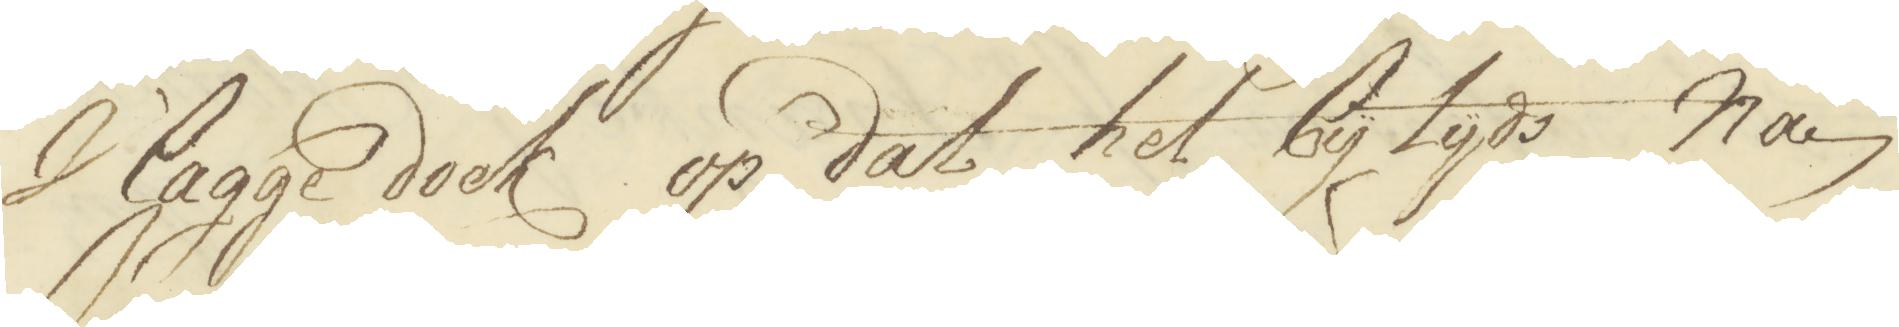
Vlagge dook op dat het bij tijds na
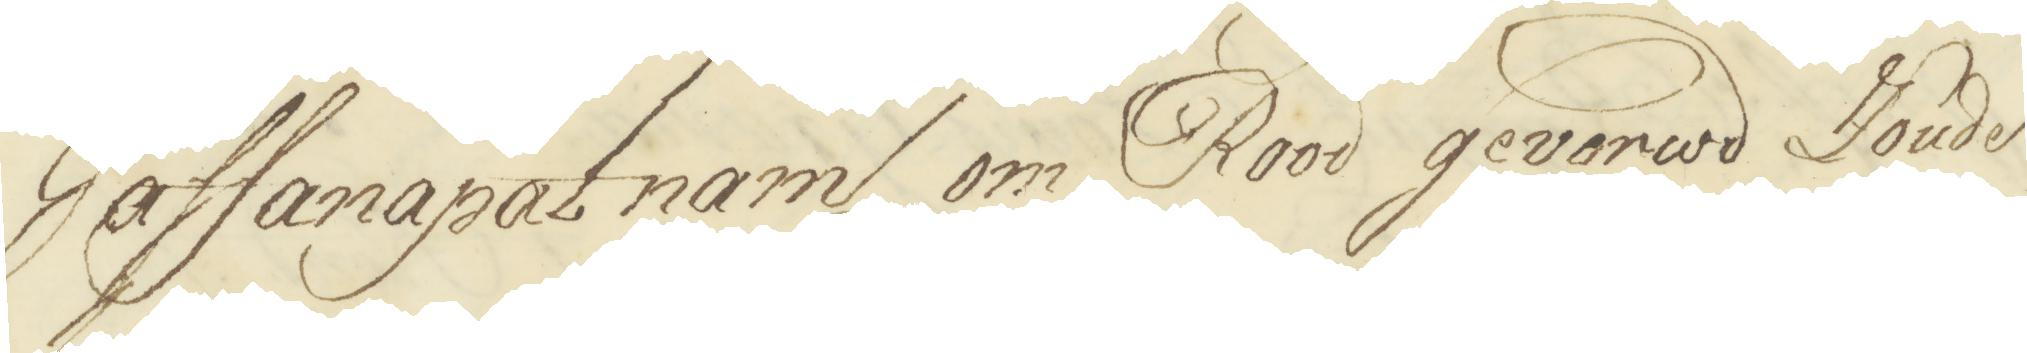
Jaffanapatnam om Rood geverwd zoude
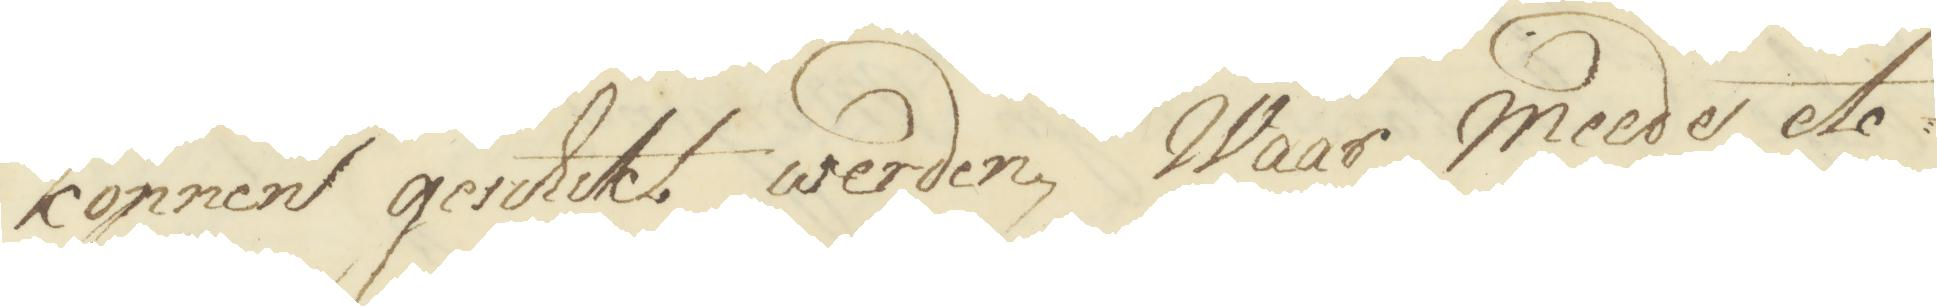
konnen geschikt werden waar meede etca
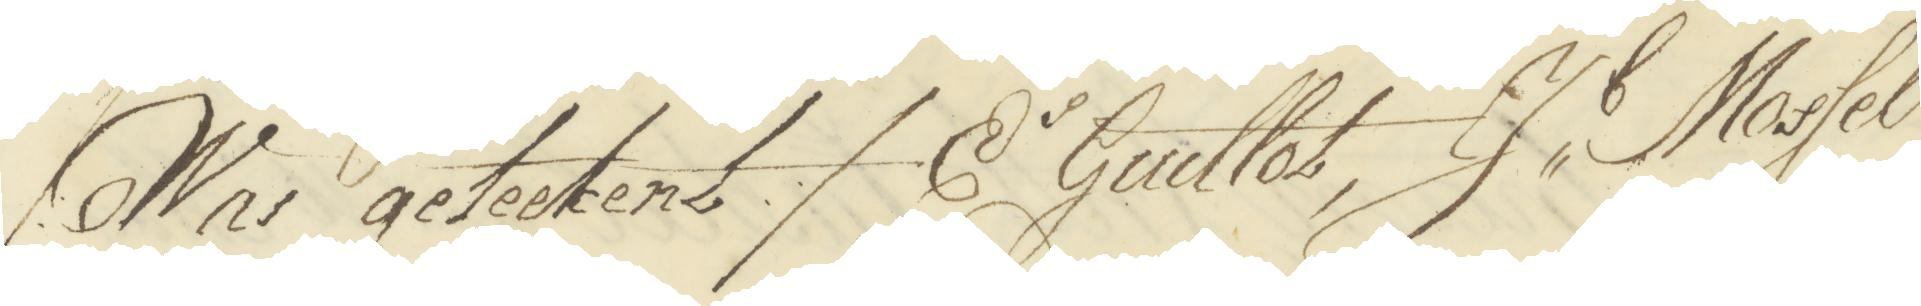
/: Was geteekent :/ Es Guillot, J„b Mossel
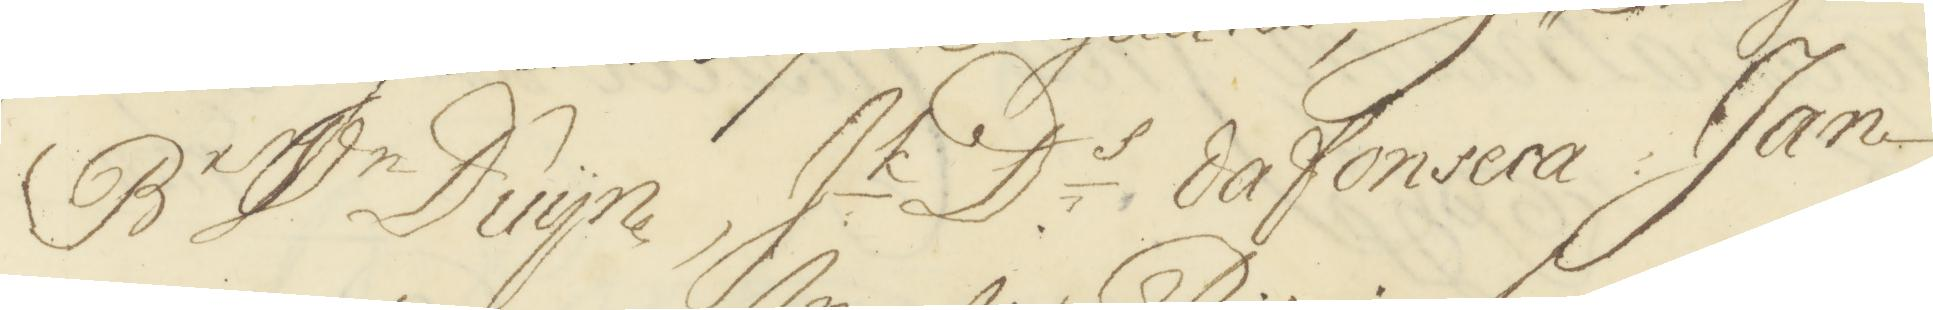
Br Vn Duijn, J=k D=s dafonseca: Jan
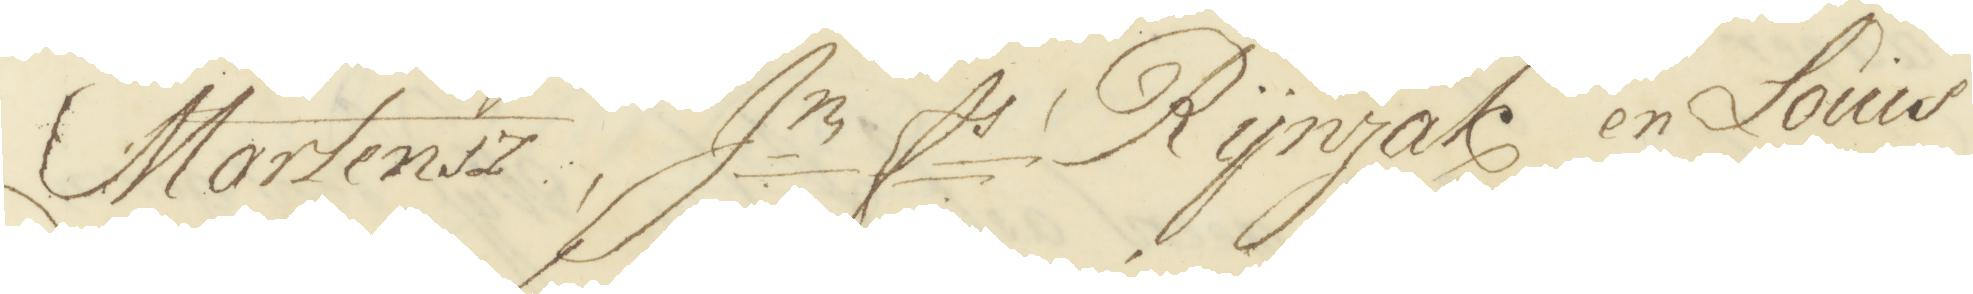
Martensz:, J=n f=s Rijnjak en Louis
